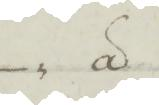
-„ a
